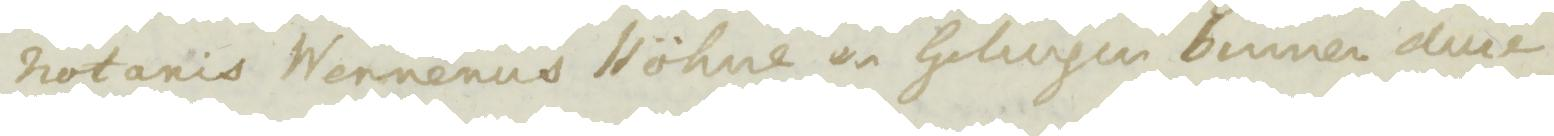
notaris Wernerus Köhne en getuigen binnen deze
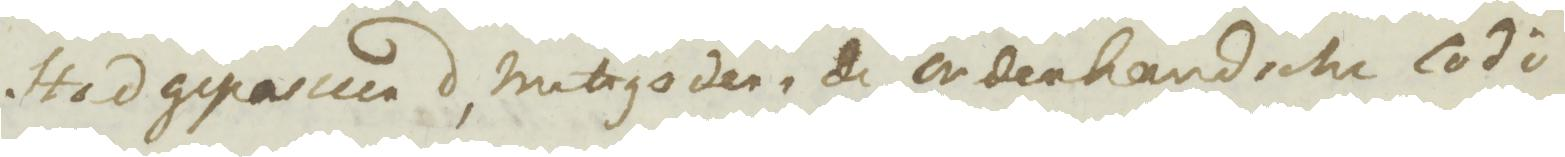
stad gepareerd, mitsgaders, de onderhandsche codi
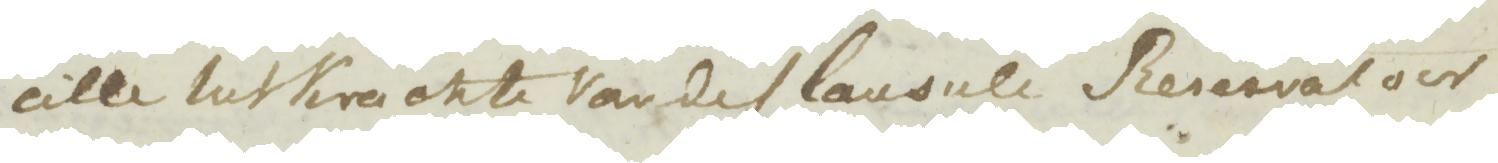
cille totKrachte van de Clausule Reservatoir
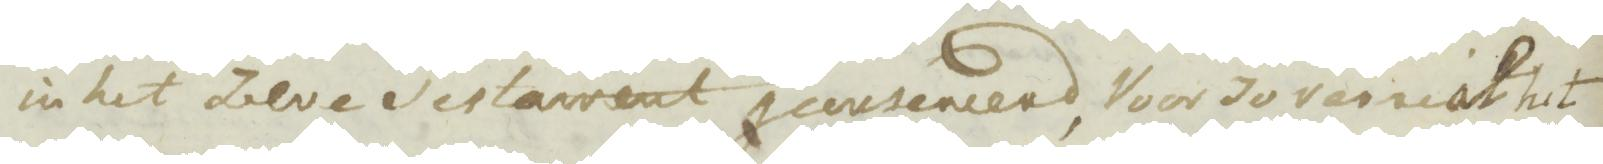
in het zelve Testament gereserveerd, voor zo verre al het
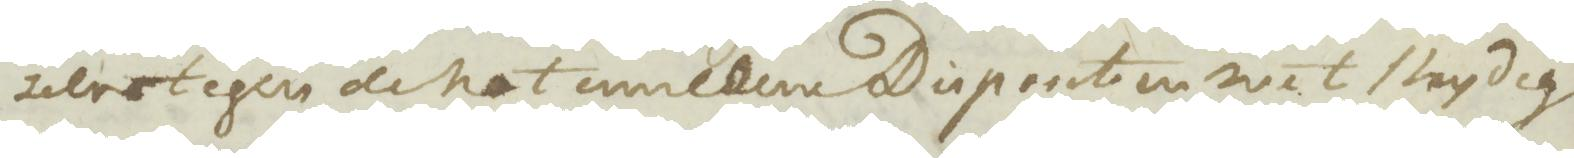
zelve tegen de natemeldene Disportien niet strydig
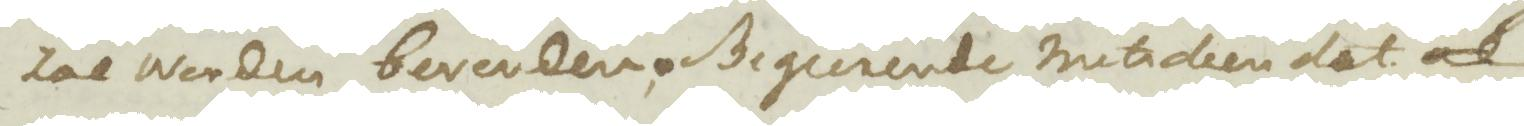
zal werden bevonden, begeerdende mitsdien dat al
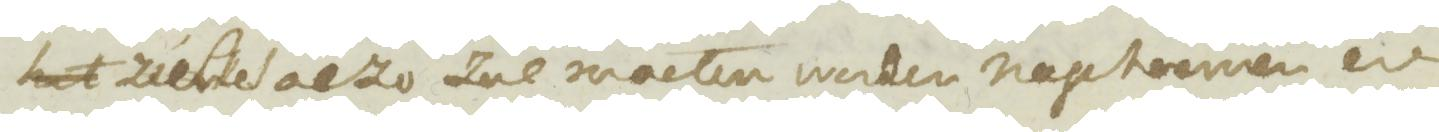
het zulkes alzo zal moeten werden nagekomen en
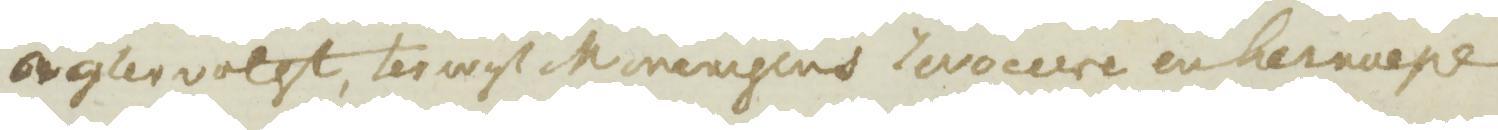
oagtervolgt, terwyl ik nergens revoceere en herroepe
